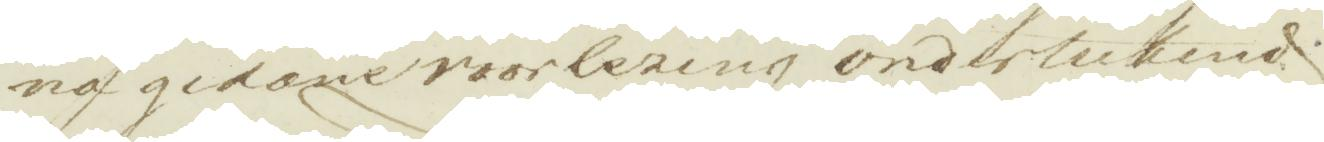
na gedane voorlezing onderteekend.
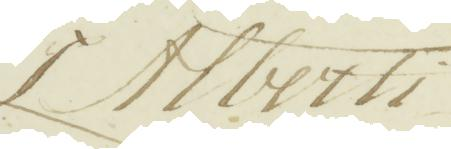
J Alberti
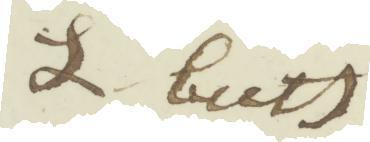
L. beets
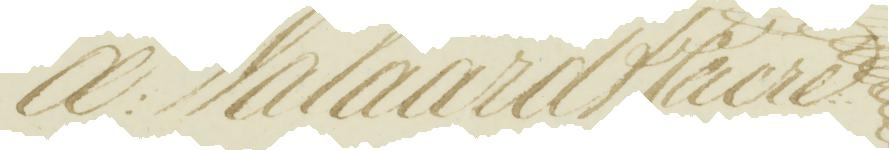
A: Walaardt Sacré
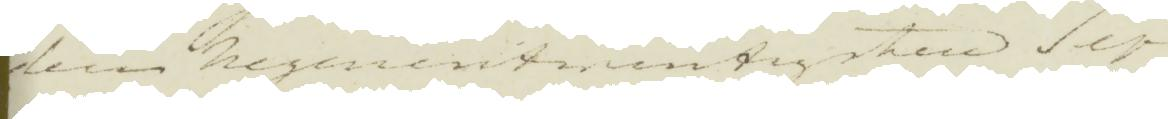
den negenentwintigsten sep
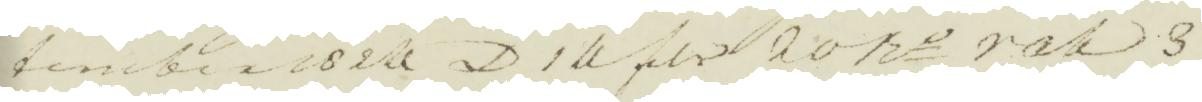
tember 1824 D 14 fol 20 r=o vak 3
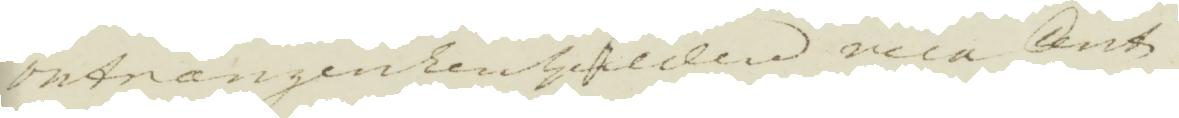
ontvangen Een Gulden vier Cents
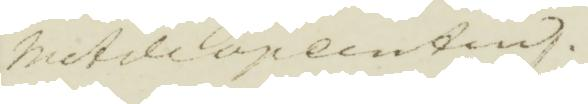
met de opcenten.
